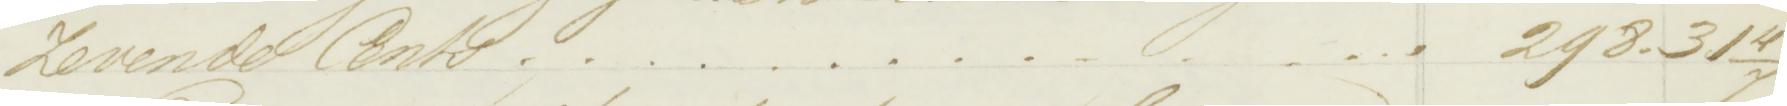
Zevende Cents . . . . . . . . . . . . . . „ 298. 31 4/7
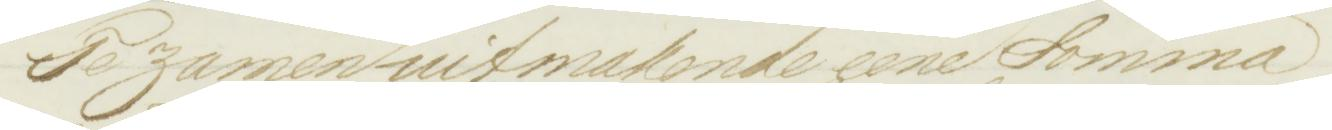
Te zamen uitmakende eene somma
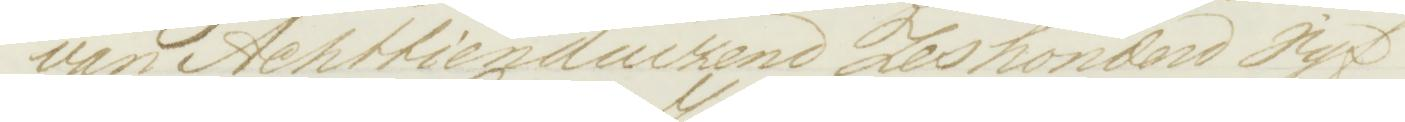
van Achttienduizend Zes honderd Vijf
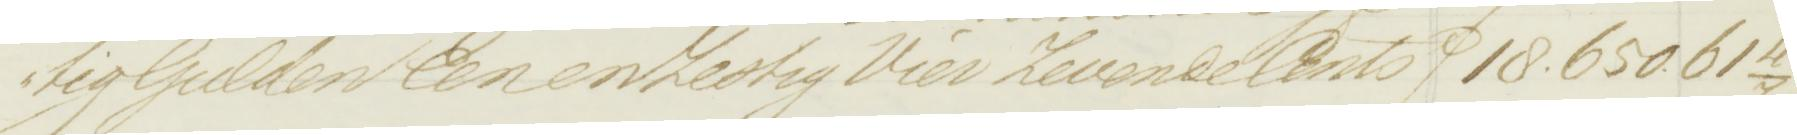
„tig Gulden Een en Zestig Vier Zevende Cents ƒ 18.650.61 4/7
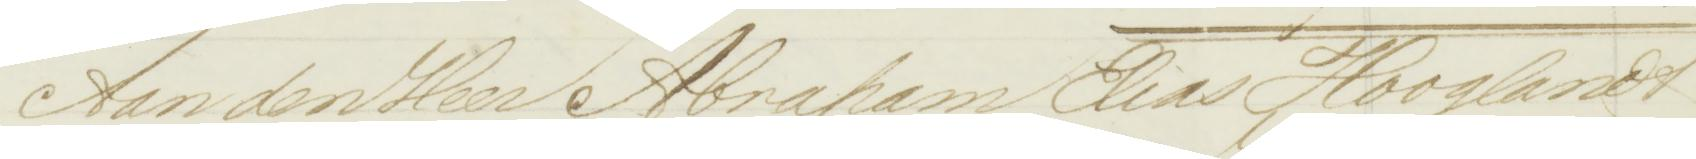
Aan den Heer Abraham Elias Hooglandt
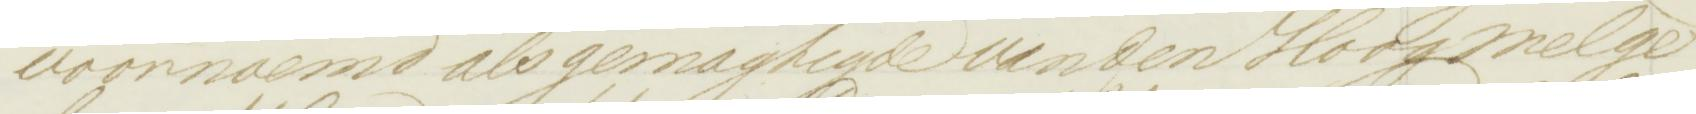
voornoemd als gemagtigde van den Hoogwelge
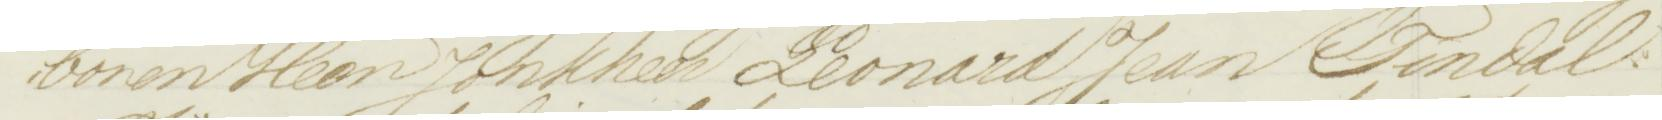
„boren Heer Jonkheer Leonard Jean Tindal:
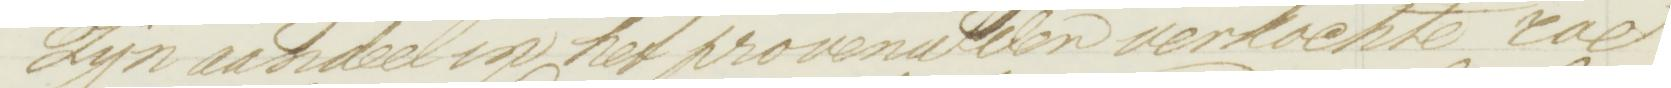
zijn aandeel in het provenu der verkochte roe
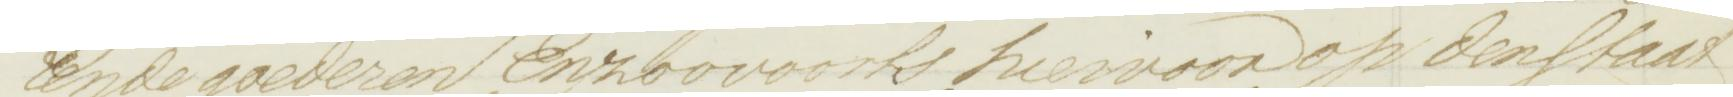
rende goederen Enzoovoorts hiervoor op den staat
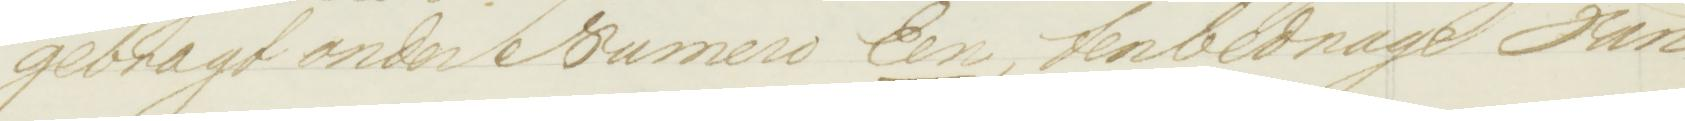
gebragt onder Numero Een, ten bedrage van
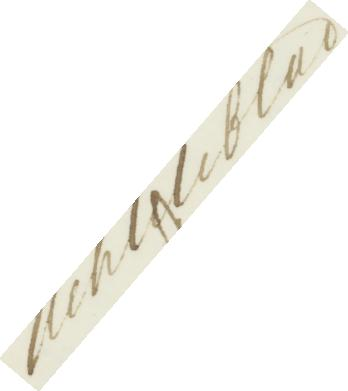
Achtsteblad
